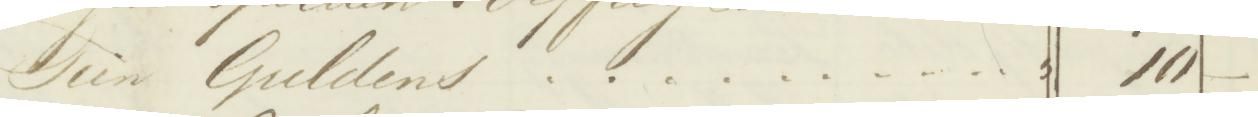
Tien Guldens . . . . . . . . . . „ 10 —
